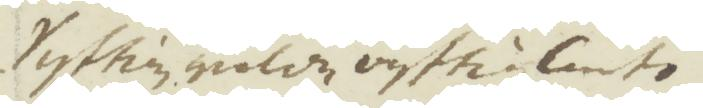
Vyftien gulden vyftig Cents
